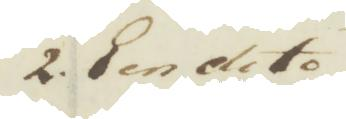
2. Een dito
